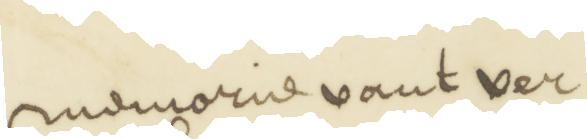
memorie van t ver
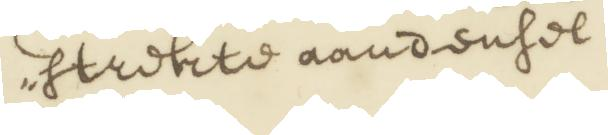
„strekte aandensel
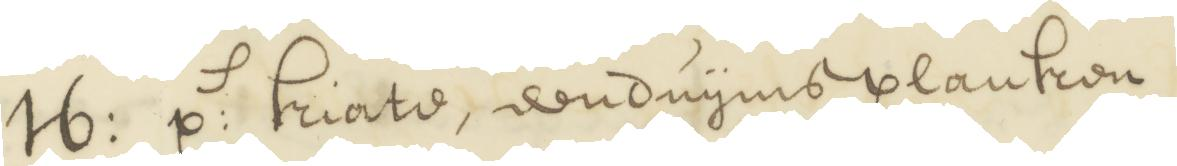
16: p:s kiate, eenduijmsplanken
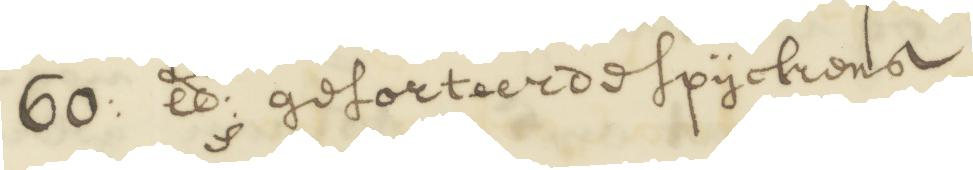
60: lb:e gesorteerde spijckers
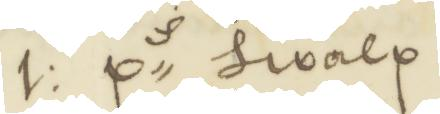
1: p„s swalp
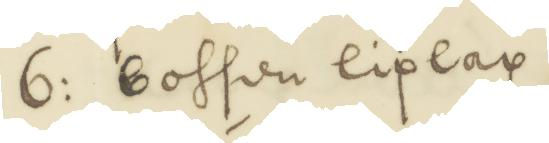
6: bossen liplap
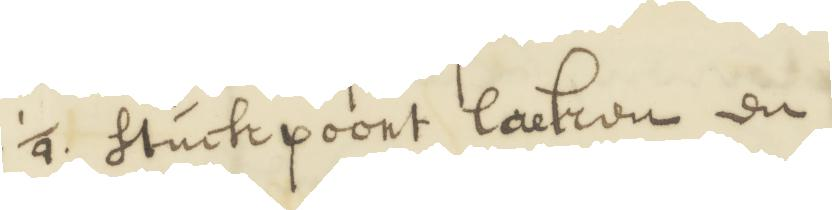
- ¼. Stuck poort laeken en
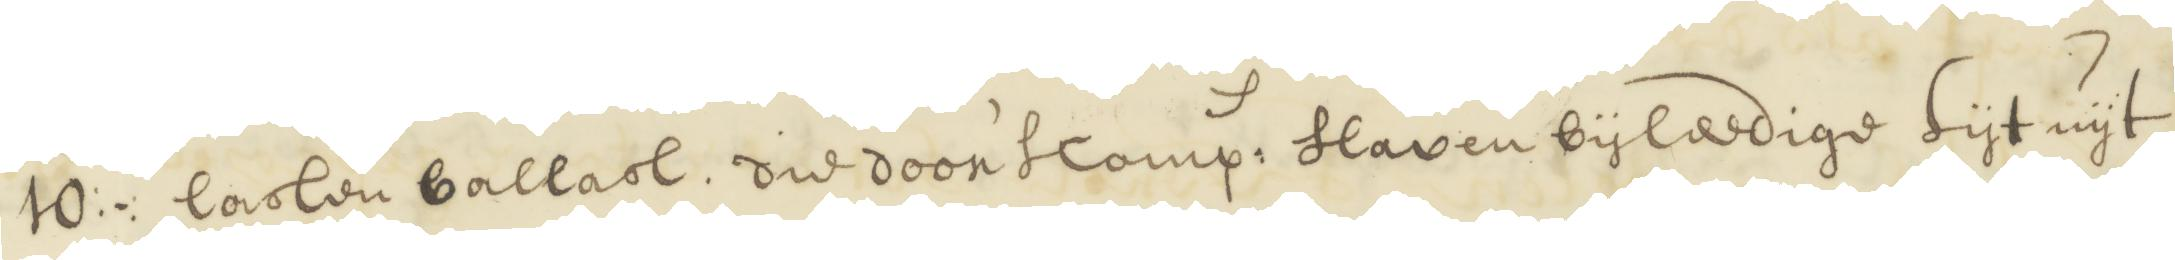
10:-: lasten ballast. die door 's Comp:s slaven bijleedige tijt uijt
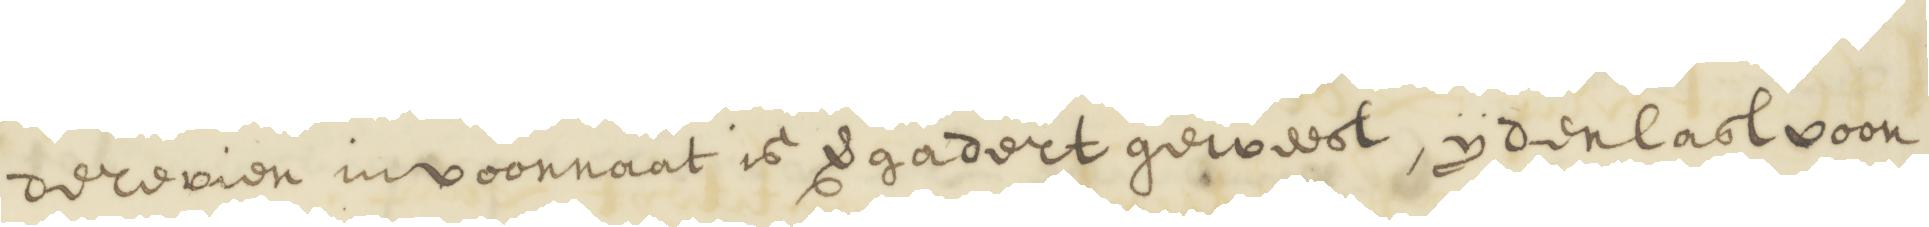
derevier invoorraat is vergadert geweest, ijderlast voor
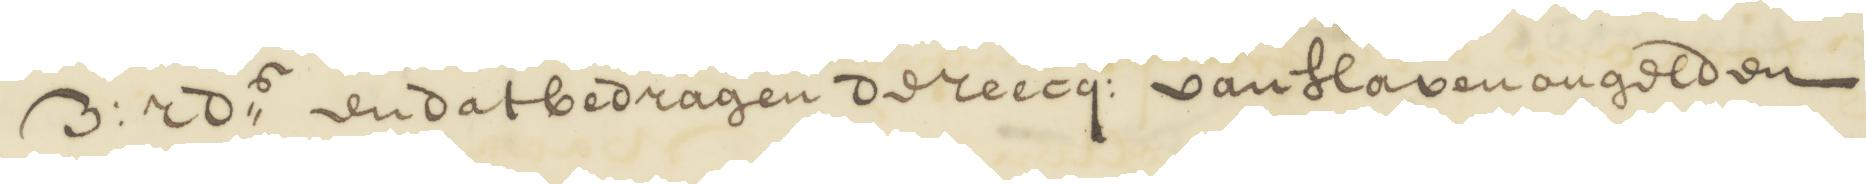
3: rd„s en dat bedragen de reecq: van slaven ongelden
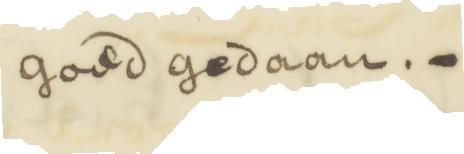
goed gedaan.-
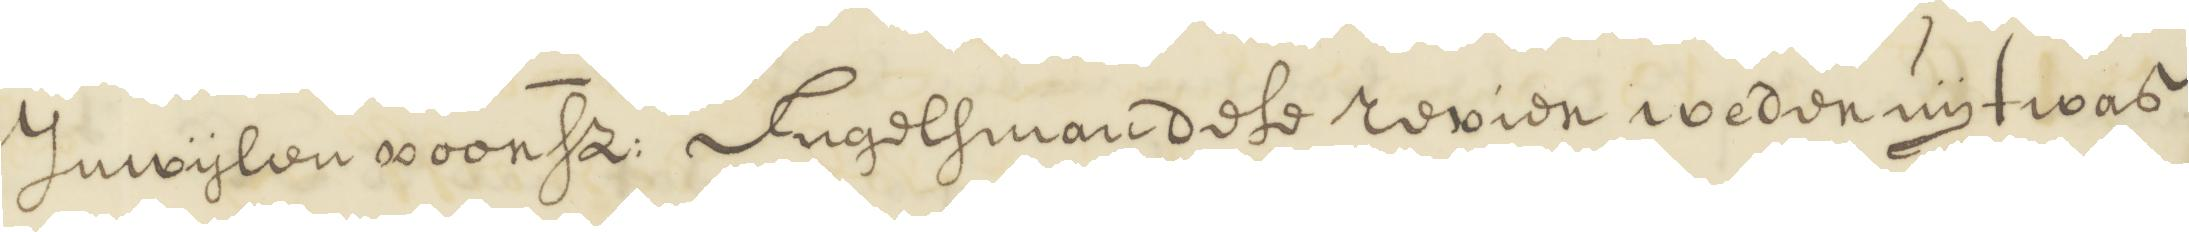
Jnwijlen voorsz: Engelsman dese revier weder uijt was
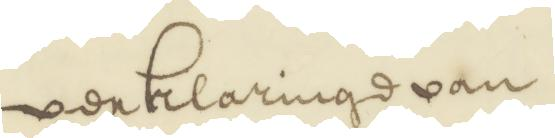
verklaringe van
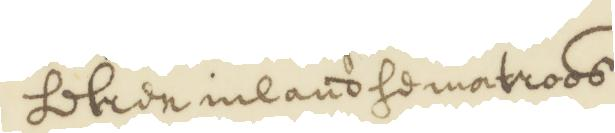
seker inlandse matroos
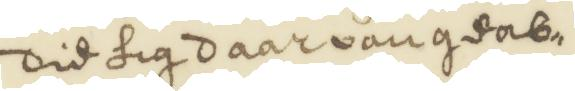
die sig daar van geab„
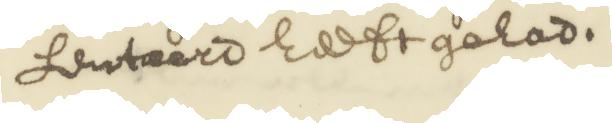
senteerd heeft gehad.
